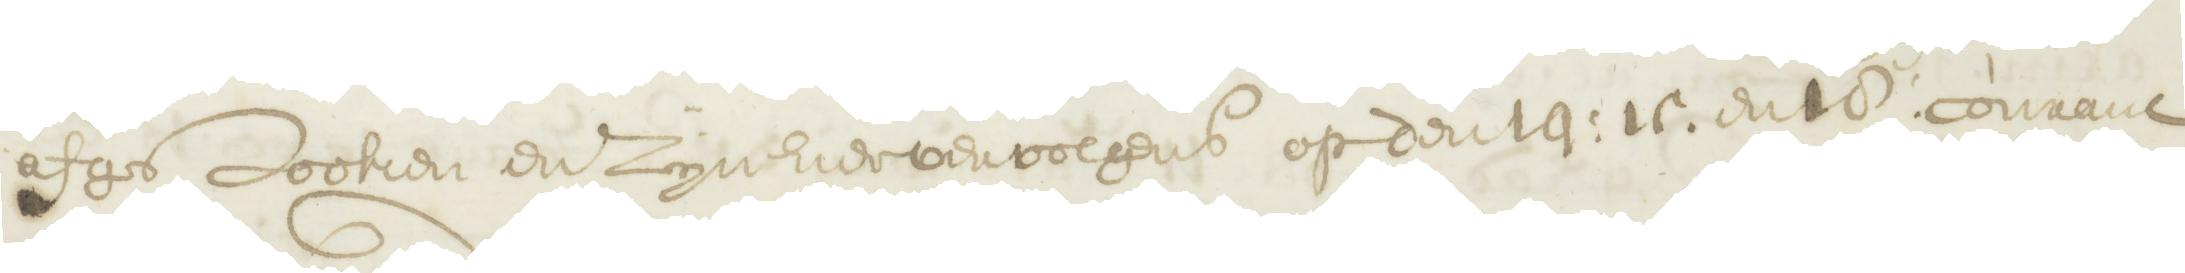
afgestooken en zijn hier vervolgens op den 14: 15. en 18:' courant
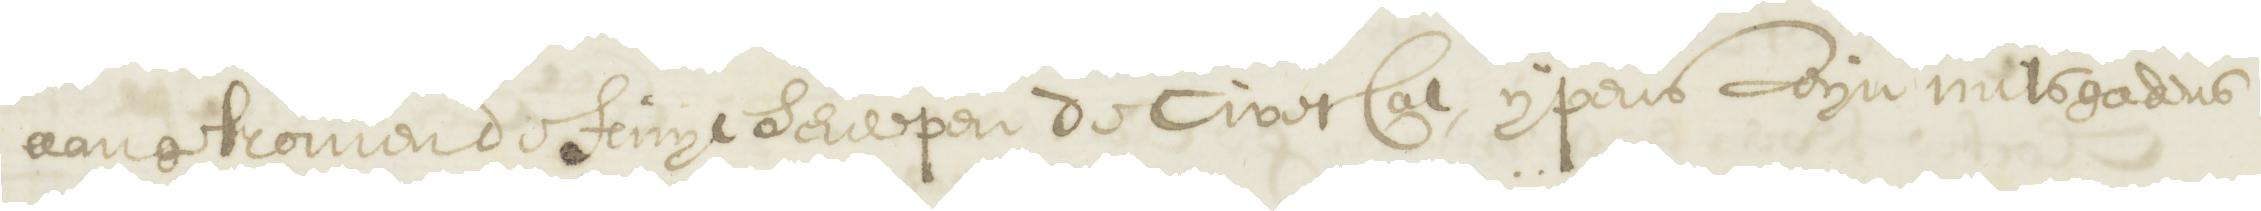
aangekomen de fluijt scheepen de Civetcat, ijpensteijn mitsgaders
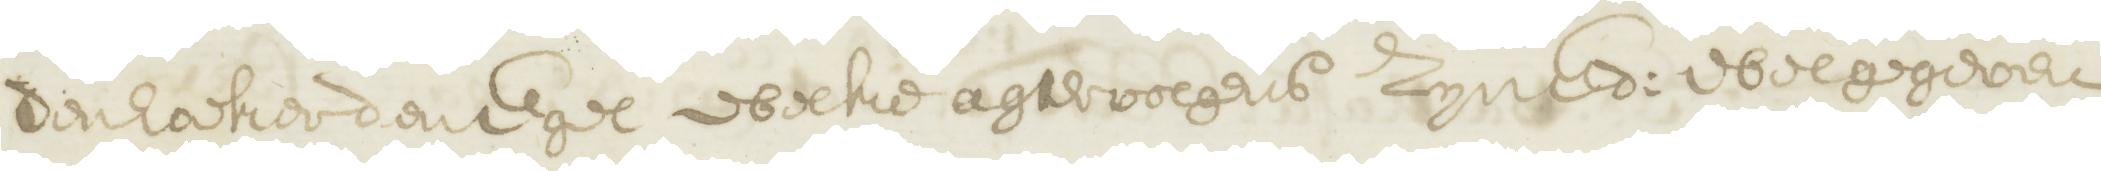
den hoeker den Egel welke agtervolgens zijn Ed: welgegeven
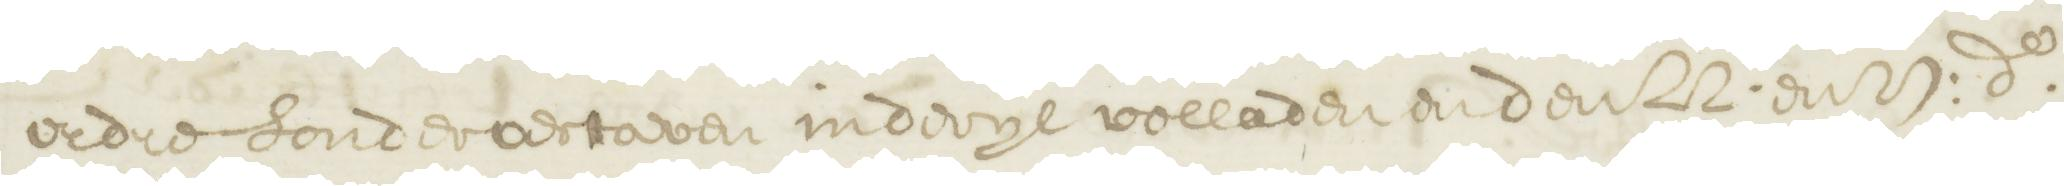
ordre sonder vertoeven inderijl volladen en den 22.' en 27: d.o
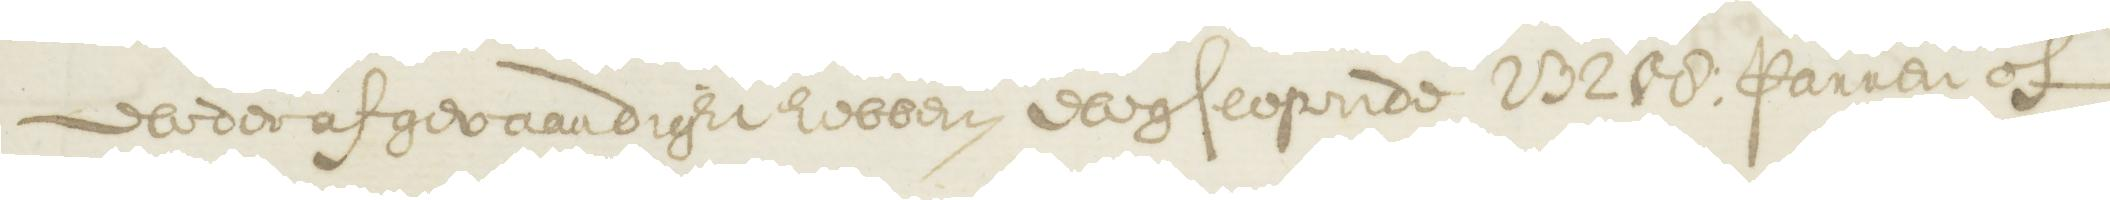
weder afgevaardight hebben, wegslepende 23258. parren of
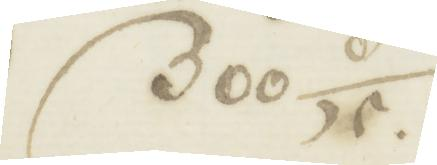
300 8/15.
